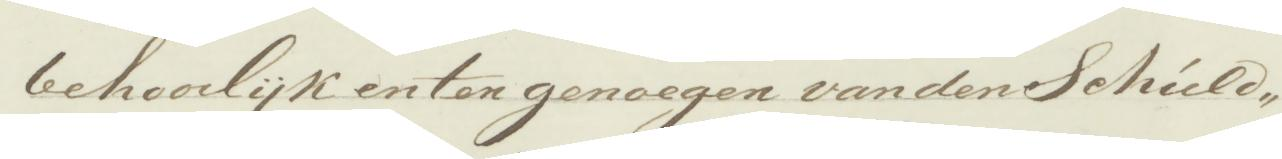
behoorlijk en ten genoegen van den Schuld,
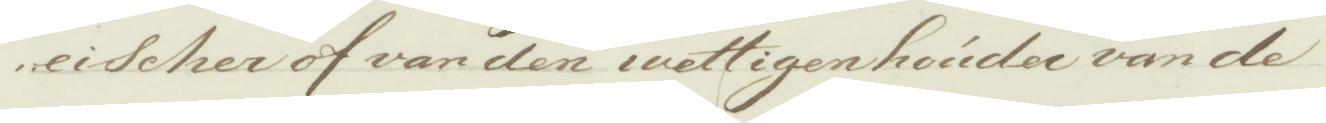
„eischer of van den wettigen houder van de
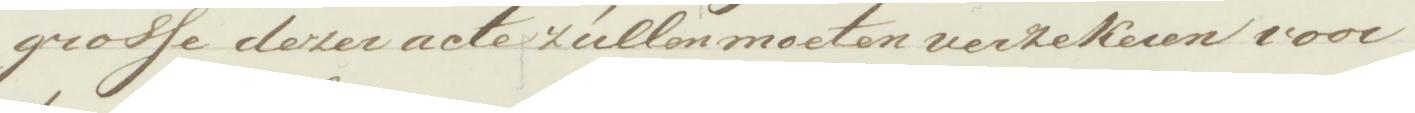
grosse dezer acte zullen moeten verzekeren voor
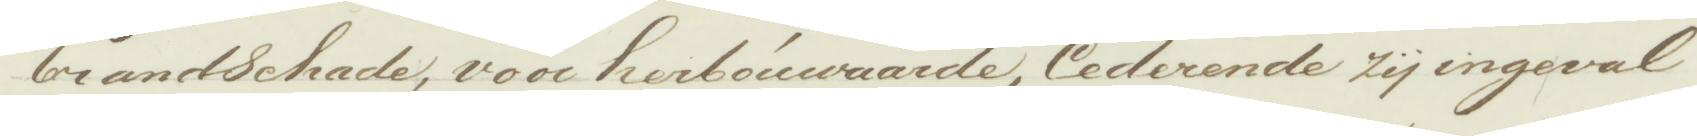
brandschade, voor herbouwaarde, cederende zij ingeval
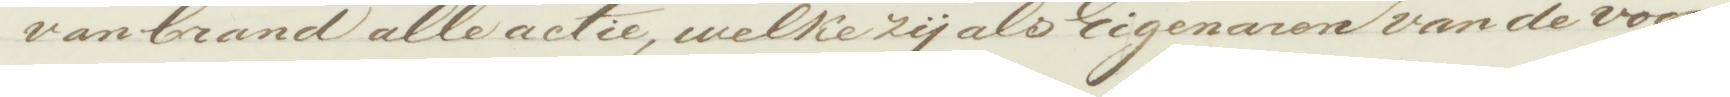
van brand alle actie, welke zij als Eigenaren van de voor
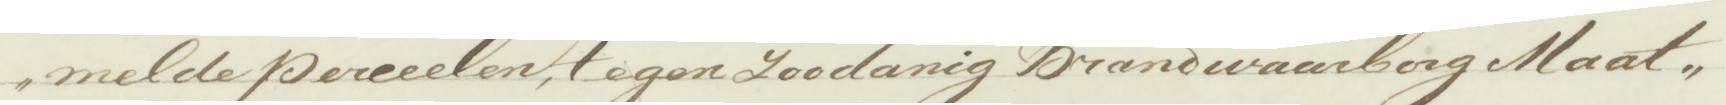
„melde perceelen, tegen zoodanig Brandwaarborg Maat„
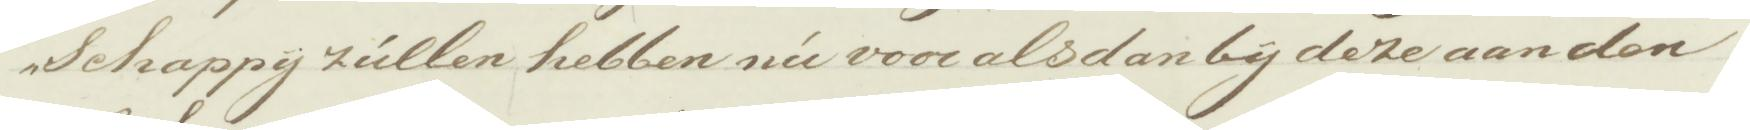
„schappij zullen hebben nu voor als dan bij deze aan den
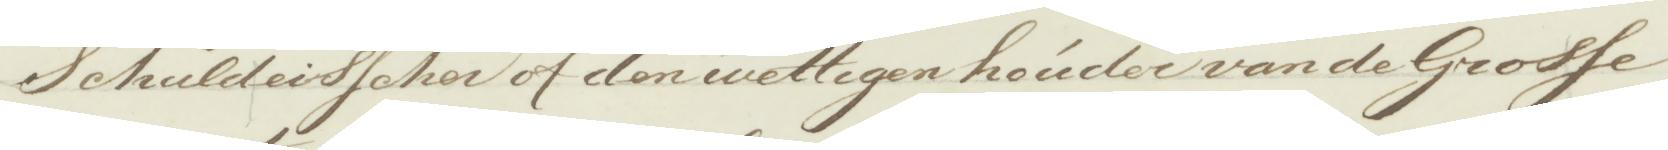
Schuldeisscher of den wettigen houder van de Grosse
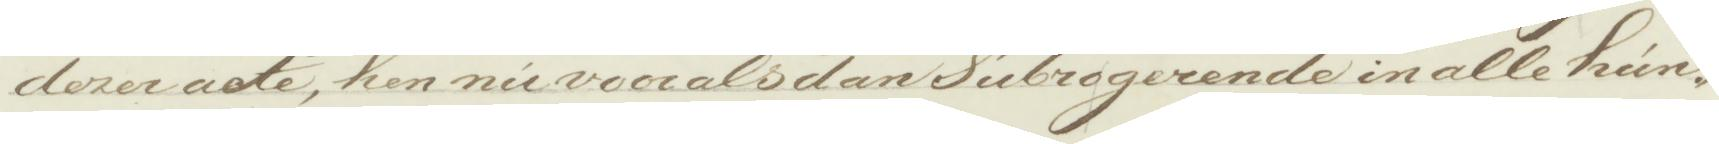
dezer acte, hen nu voor als dan Subrogerende in alle hun„
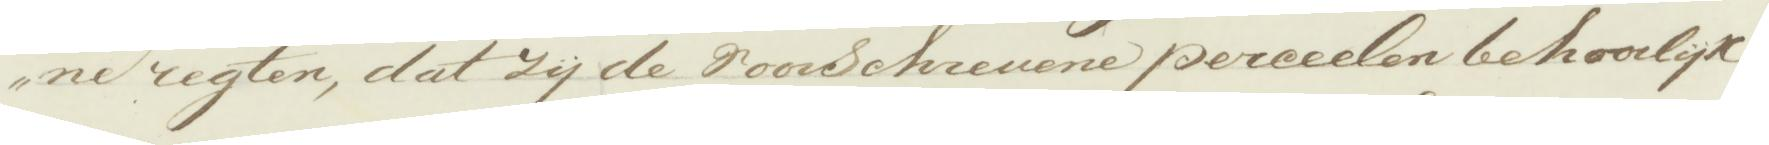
„ne regten, dat zijde voorschrevene perceelen behoorlijk
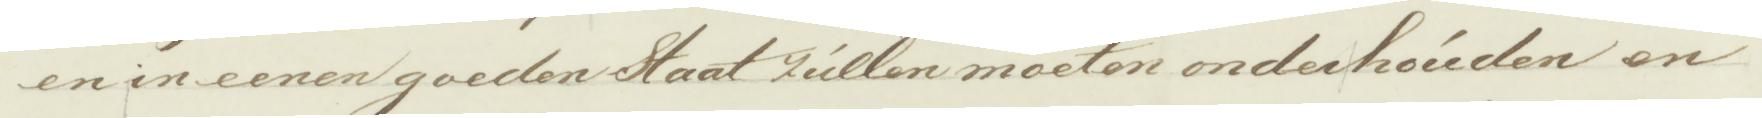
en in eenen goeden staat zullen moeten onderhouden en
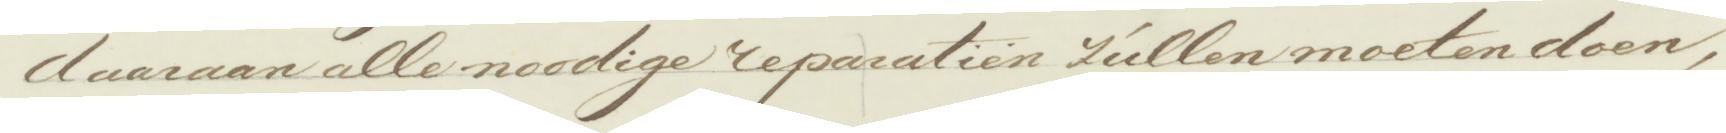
daaraan alle noodige reparatien zullen moeten doen,
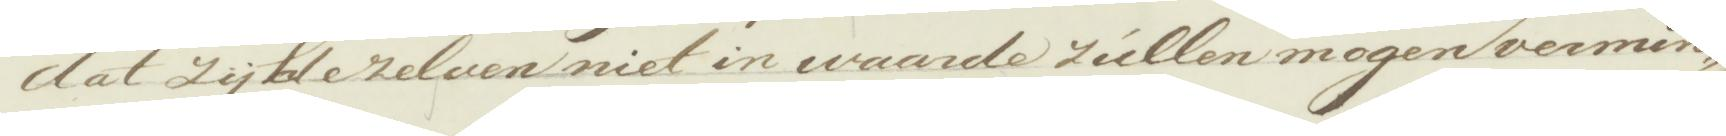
dat zij dezelven niet in waarde zullen mogen vermin„
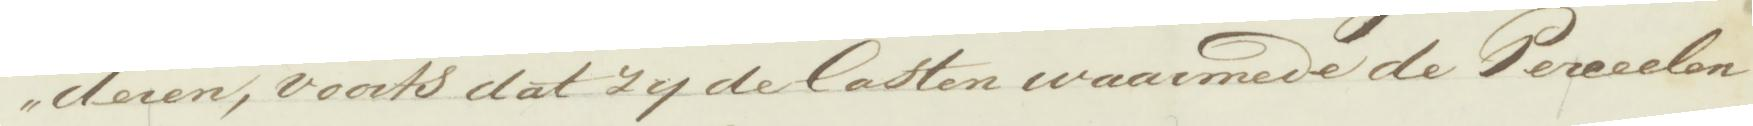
„deren, voorts dat zy de lasten waarmede de Perceelen
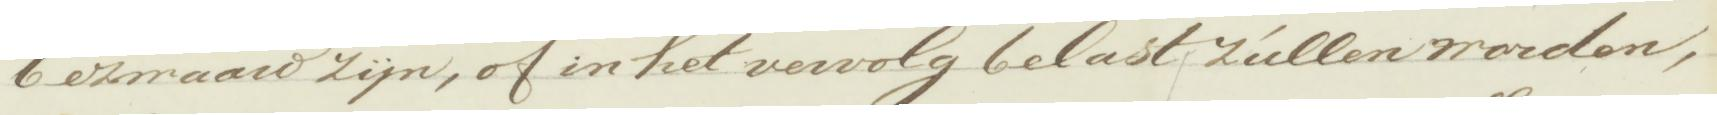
bezwaard zijn, of in het vervolg belast zullen worden,
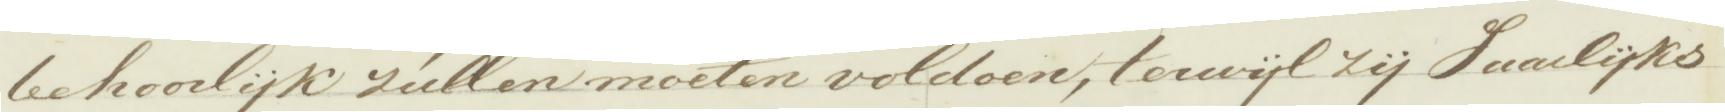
behoorlijk zullen moeten voldoen, terwijl zij Iaarlijks
